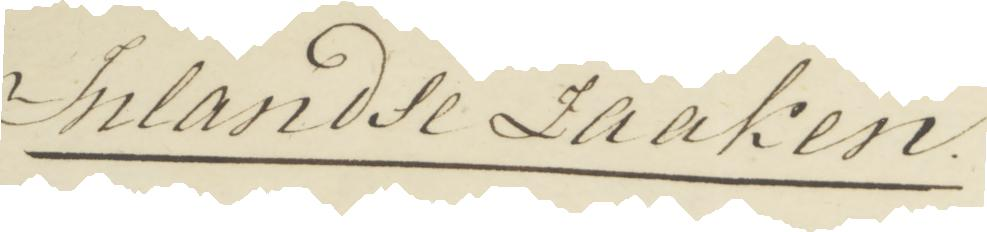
Jnlandse zaaken.
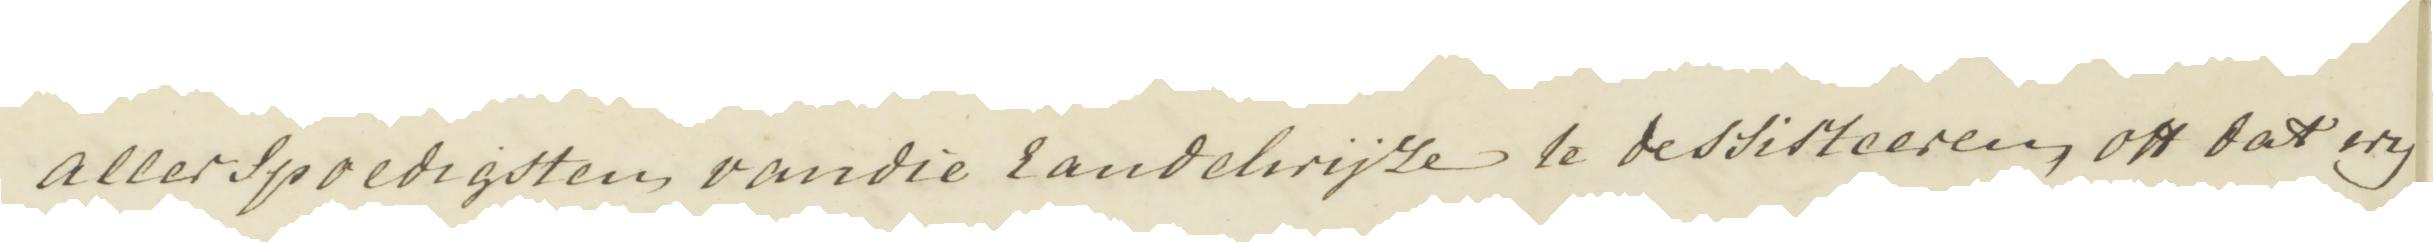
aller spoedigsten van die handelwijze te dessisteeren, off dat wy
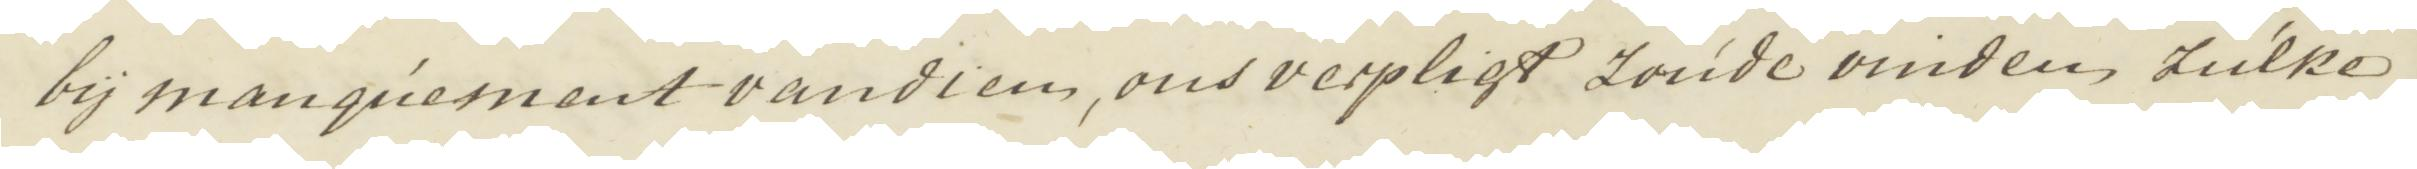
bij manquement vandien, ons verpligt zoude vinden zulke
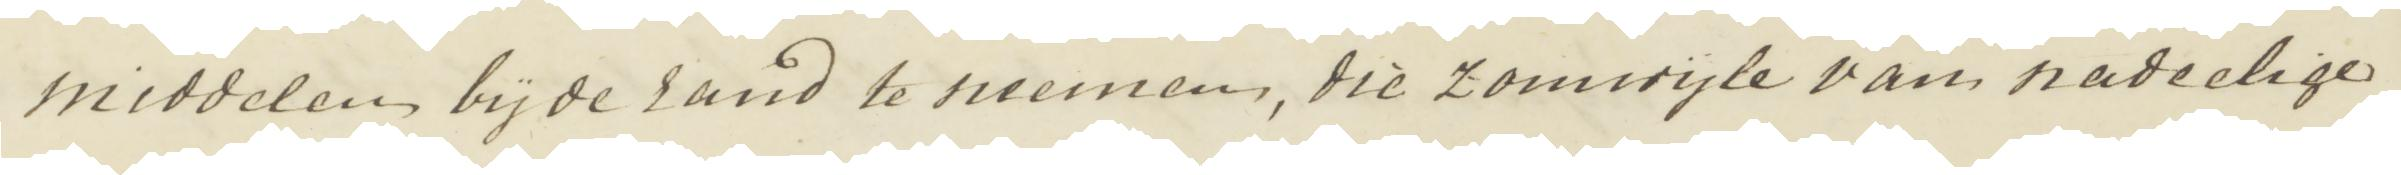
middelen bij de hand te neemen, die zomwijle van nadeelige
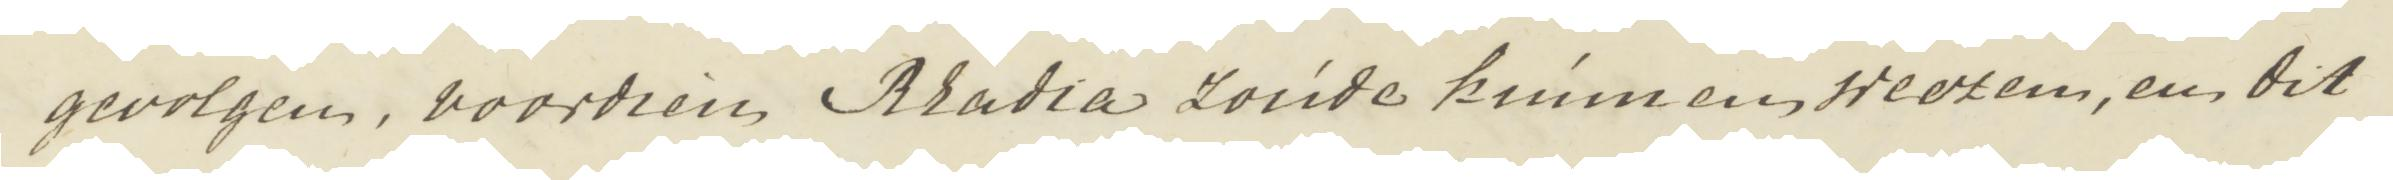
gevolgen, voordien Ahadia zoude kunnen weezen, en dit
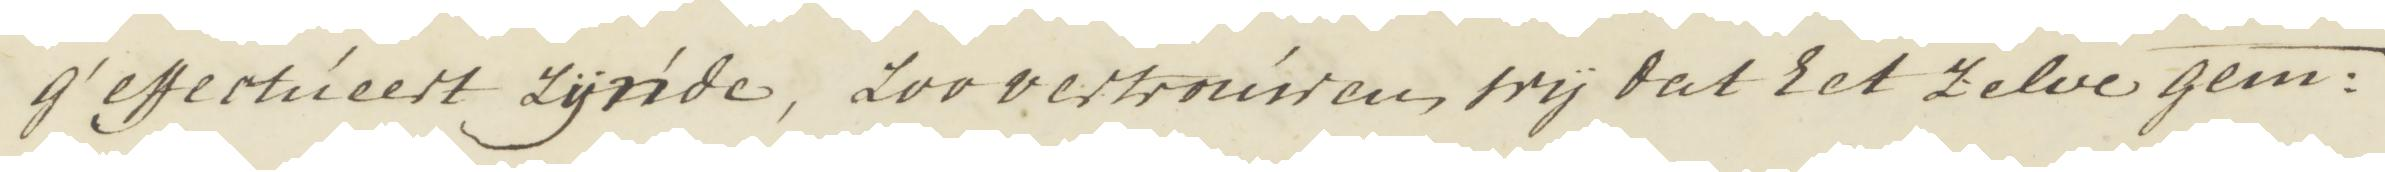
g’effectueert zijnde, zoo vertrouwen wij dat het zelve gem:
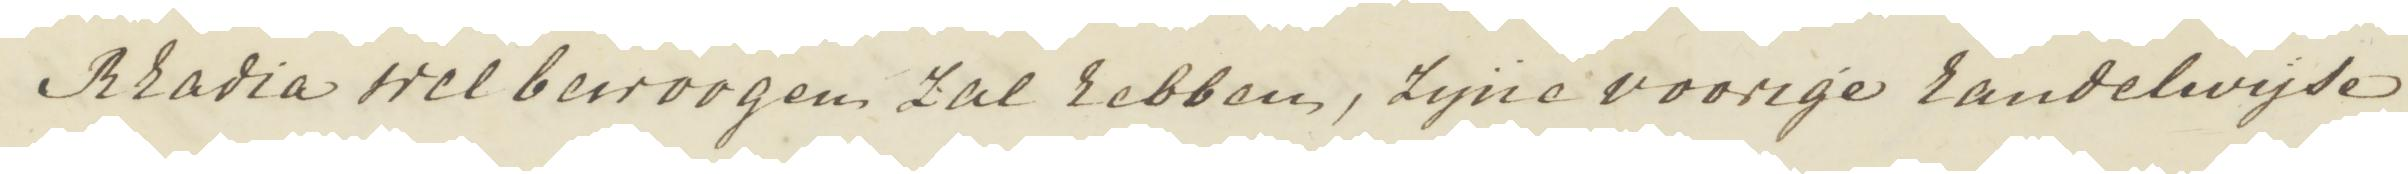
Rhadia wel bewoogen zal hebben, zijne voorige handelwijse
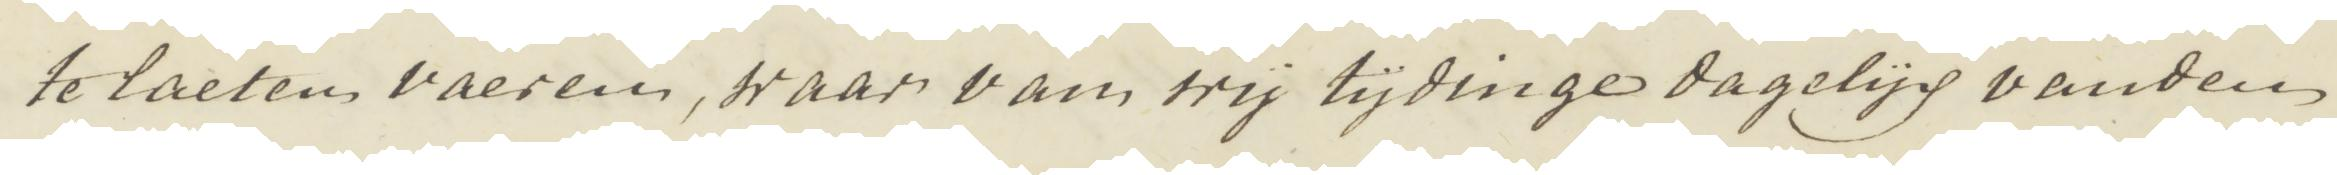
te laeten vaeren, waar van wij tijdinge dagelijx van den
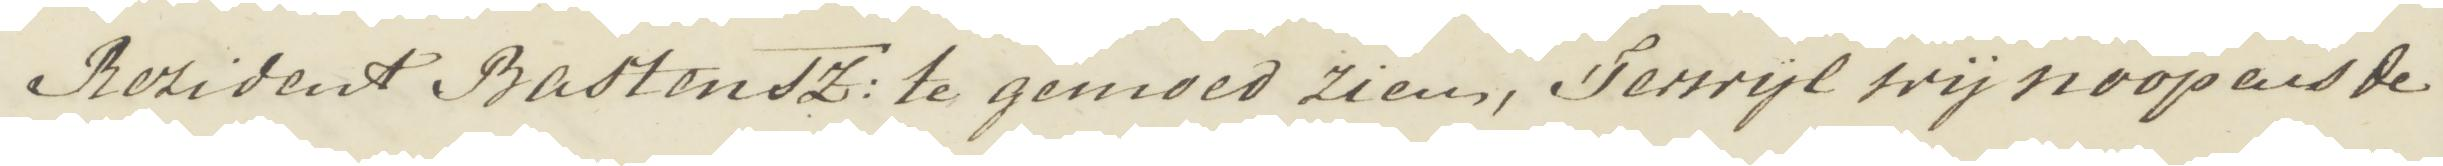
Rezident Bastensz: te gemoed zien, Terwijl wij noopens de
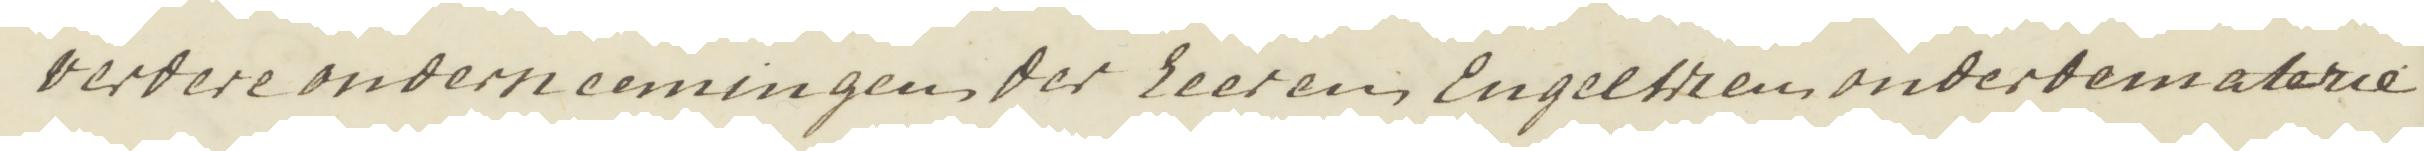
verdere onderneemingen der heeren Engelszen onder de materie
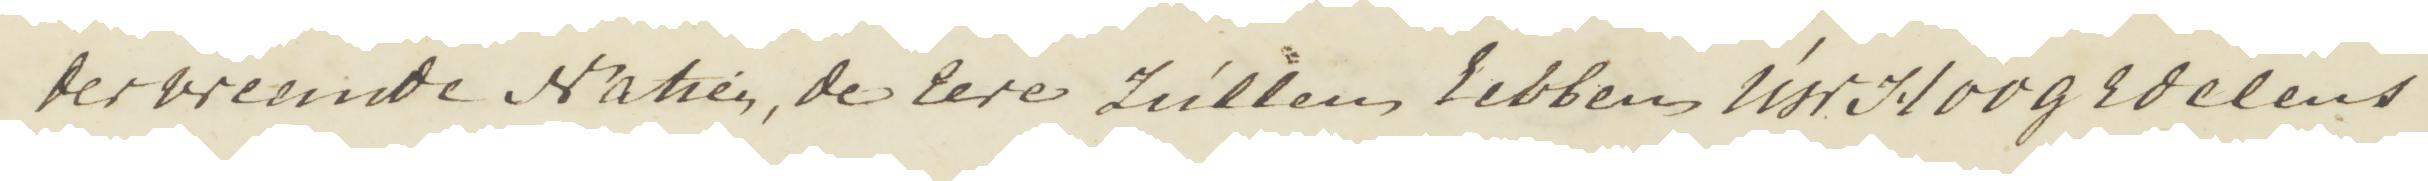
der vreemde Natien, de Eere zullen hebben Uw Hoog Edelens
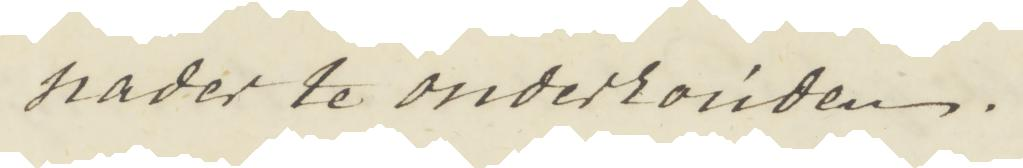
nader te onderhouden.
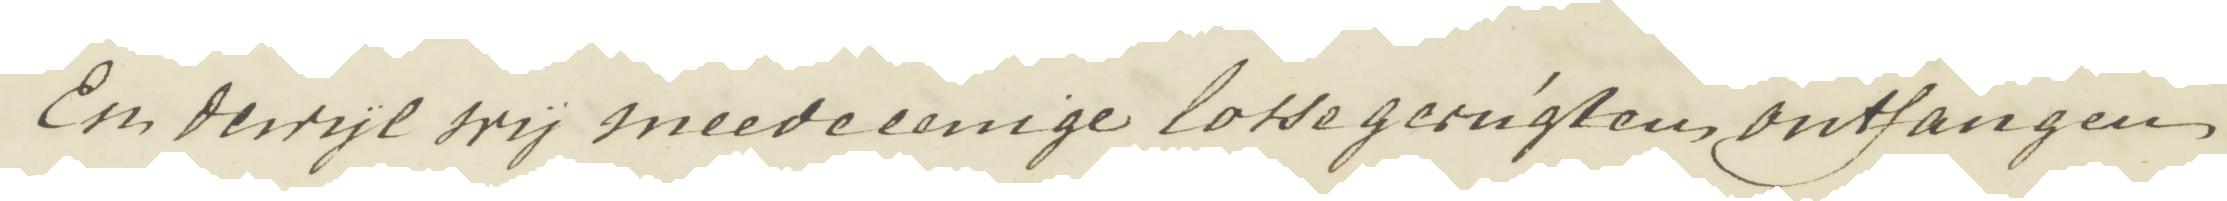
En dewijl wij meede eenige lotse gerugten ontfangen
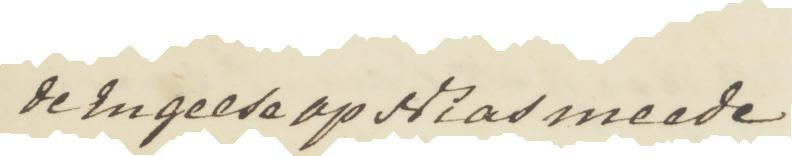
de Engelse op Nias meede
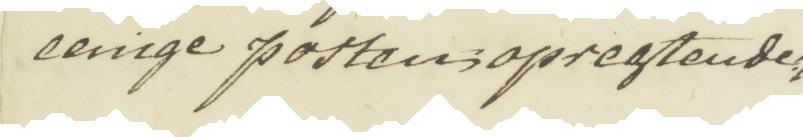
eenige posten opregtende.
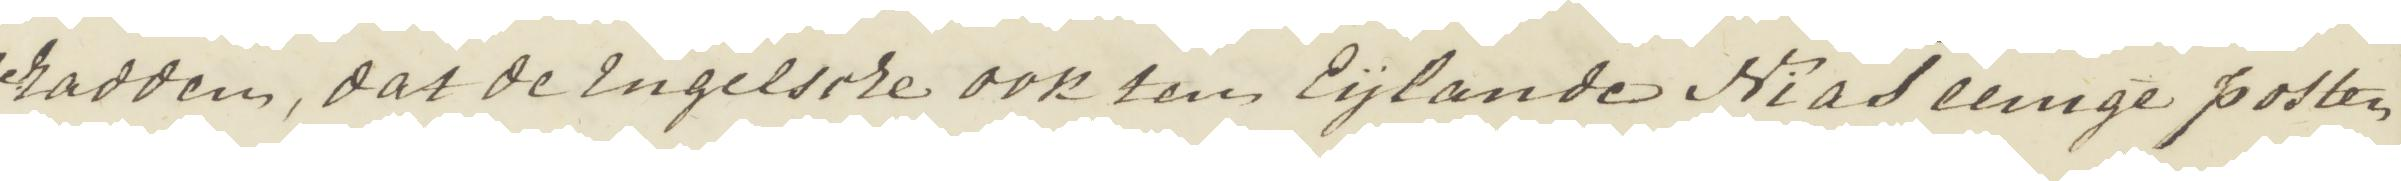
hadden, dat de Engelsche ook ten Eijlande Nias eenige posten
